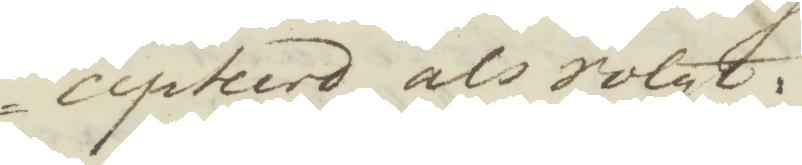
= cepteerd als volgt:
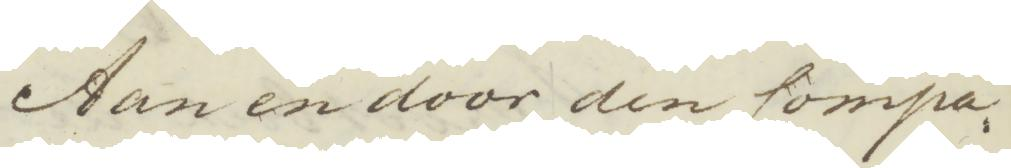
Aan en door den Compa„
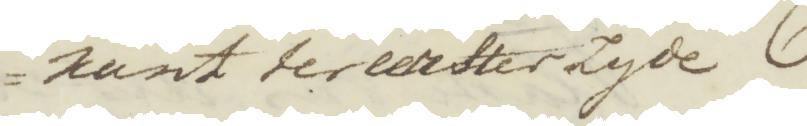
= rant ter eerster zyde
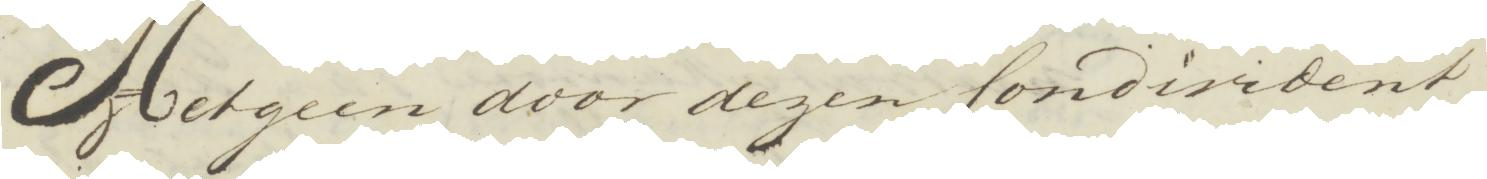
Hetgeen door dezen Condivident
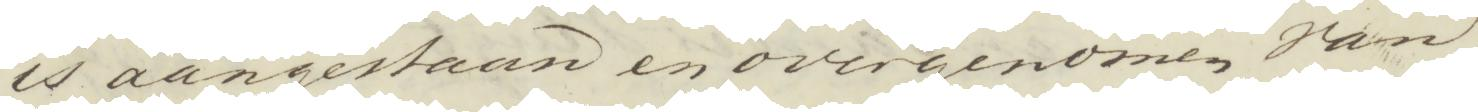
is aangestaan en overgenomen van
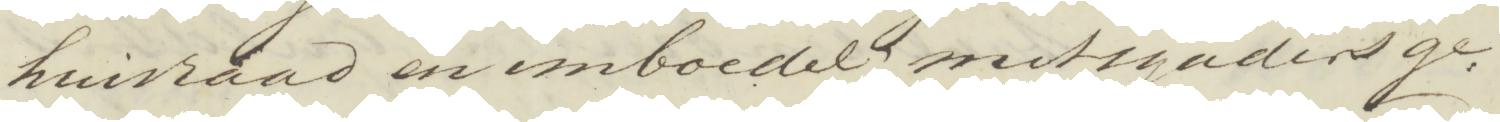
huisraad en imboedel, mitsgaders ge:
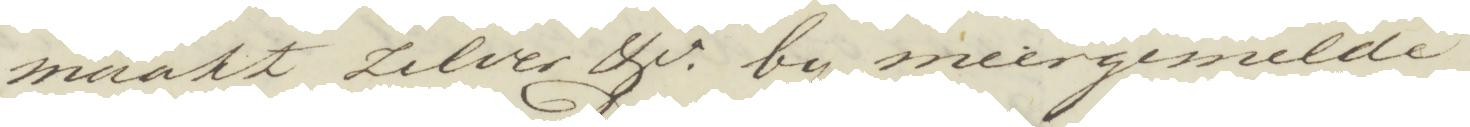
maakt zilver &c.a by meergemelde
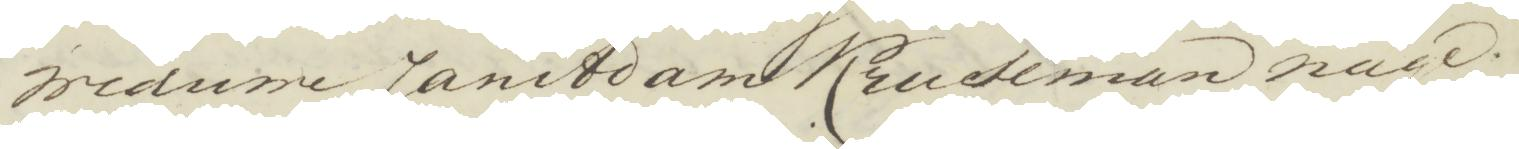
weduwe JanAdam Kruseman nage„
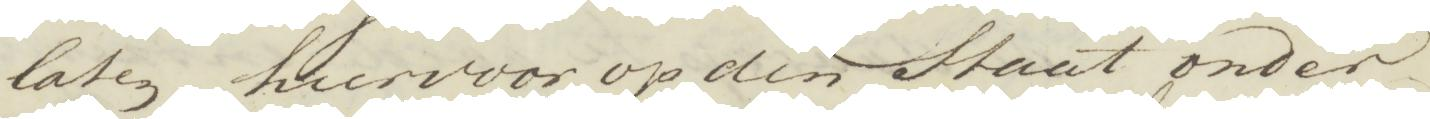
laten, hiervoor op den Staat onder
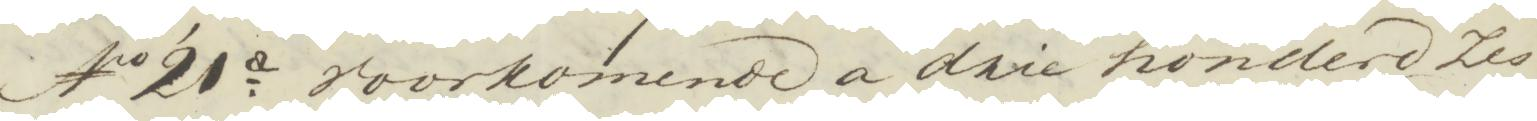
N=o 21=a voorkomende a drie honderd zes
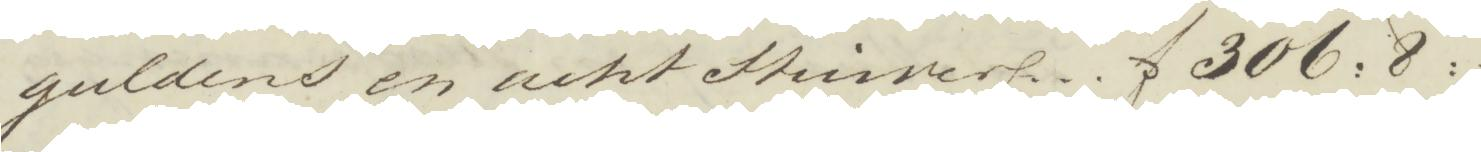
guldens en acht stuivers - - - ƒ 306: 8 :
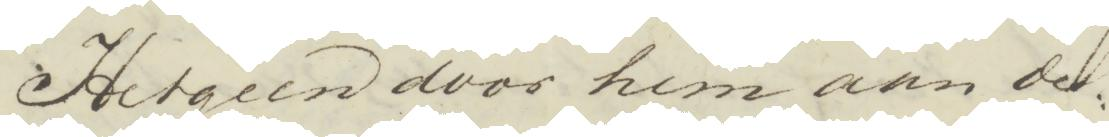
Hetgeen door hem aan de
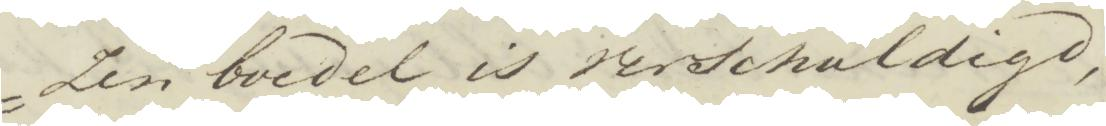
=zen boedel is verschuldigd,
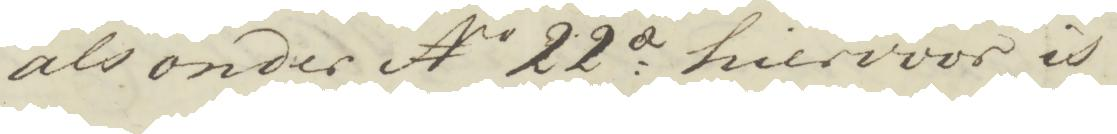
als onder N=o 22=a hiervoor is
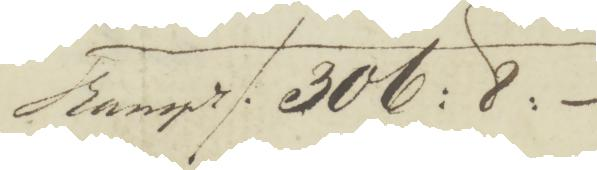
Transptƒ 306: 8 . —
